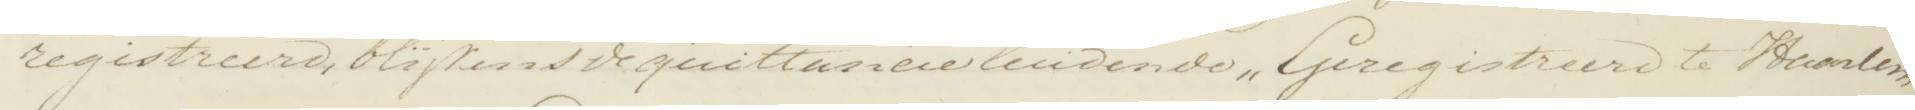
registreerd, blijvens de quittancie luidende ,,Geregistreerd te Haarlem
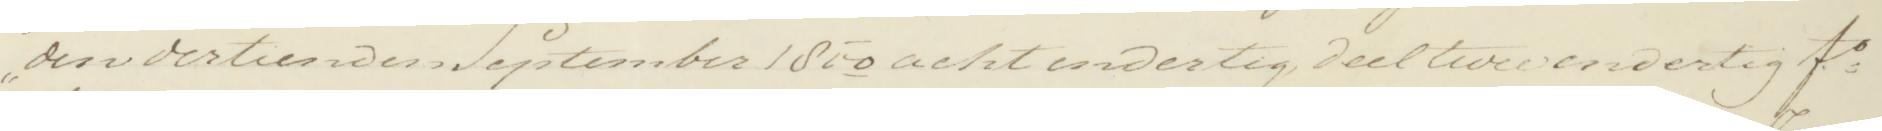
„den dertienden September 1850 acht endertig, deel twee endertig f=o
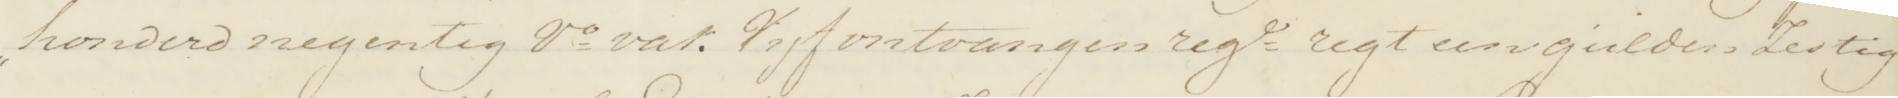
„honderd negentig V=o vak Vyf ontvangen reg=e regt een gulden Zestig
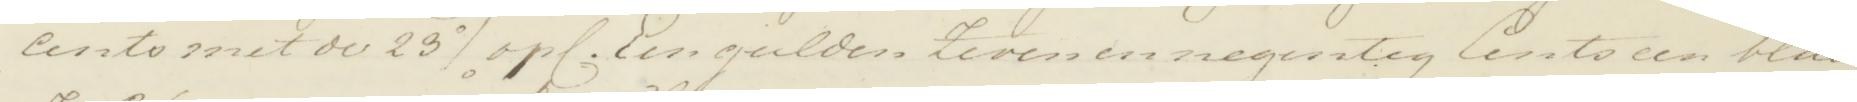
cents met de 23% opC. Een gulden zeven en negentig Cents een blad
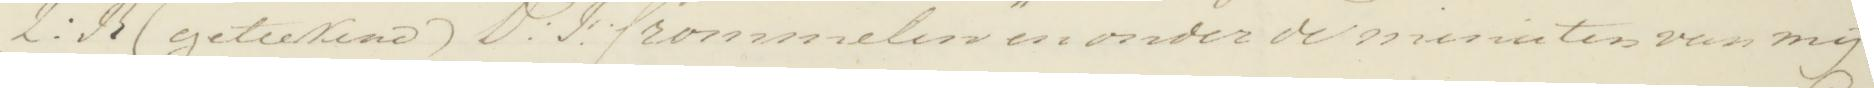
Z: R (geteekend) D: F: Crommelin" en onder de minuten van mij
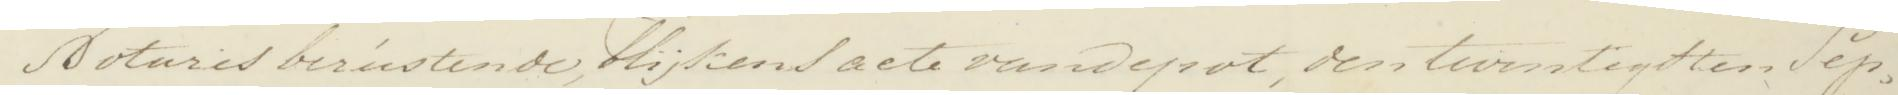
Notaris berustende, blijkens acte van depot, den twintigsten Sep
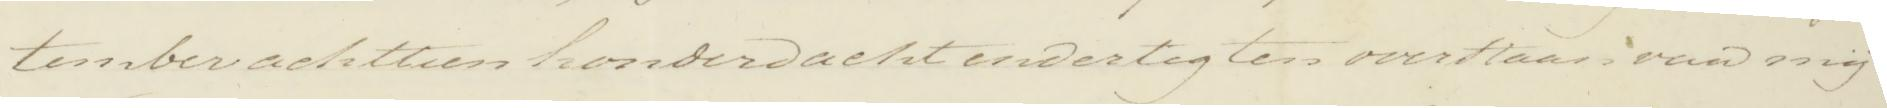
tember achttien honderd acht endertig ten overstaan van mij
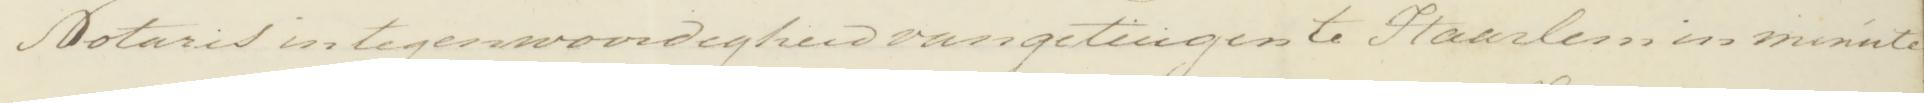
Notaris in tegenwoordigheid van getuigen te Haarlem in minute
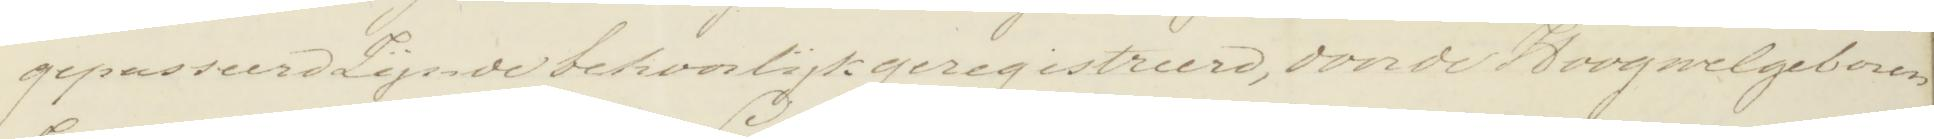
gepasseerd Zijnde behoorlijk geregistreerd, door de Hoogwelgeboren
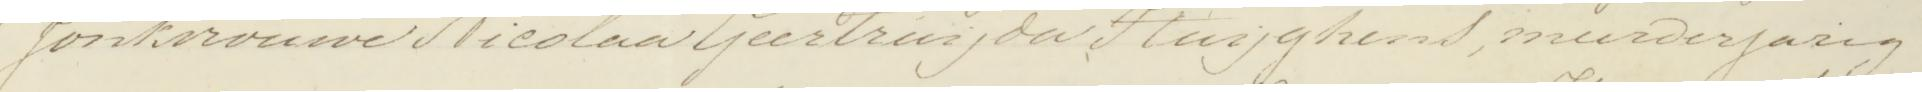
Jonkvrouwe Nicolaa Geertruijda Huijghens, meerderjarig
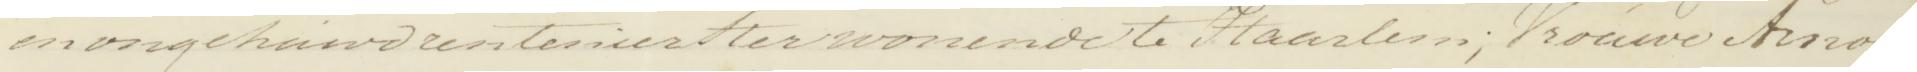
en ongehuwd rentenierster wonende te Haarlem; Vrouwe Arnou
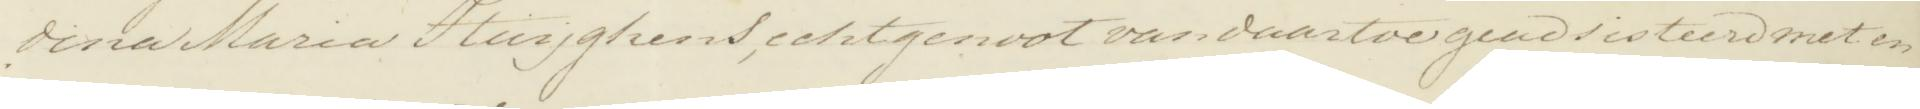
dina Maria Huijghens, echtgenoot van daartoe geadsisteerd met en
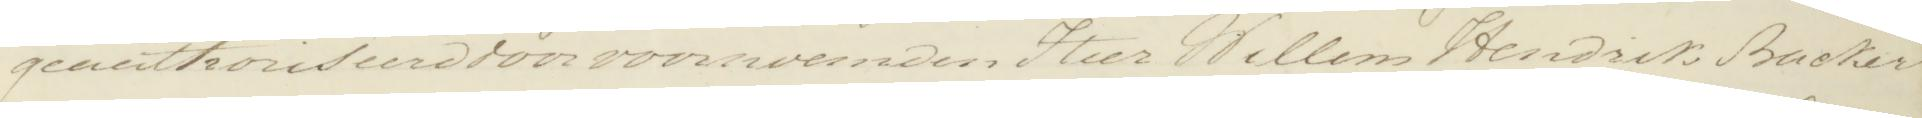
geauthoriseerd door voornoemden Heer Willem Hendrik Backer
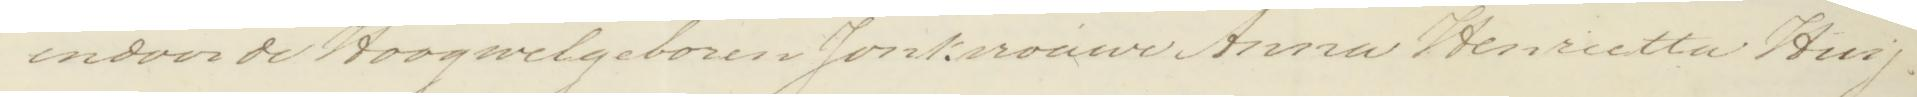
endoor de Hoogwelgeboren Jonkvrouwe Anna Henrietta Huijg
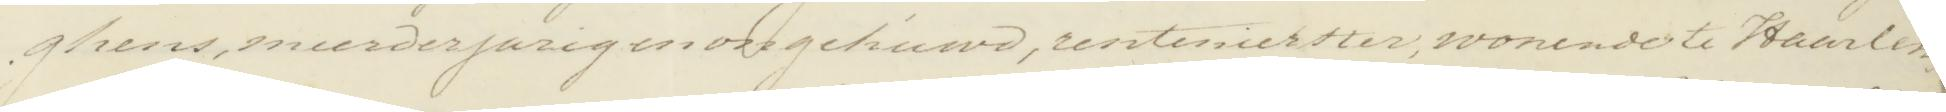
ghens, meerderjarig en ongehuwd, rentenierster, wonende te Haarlem
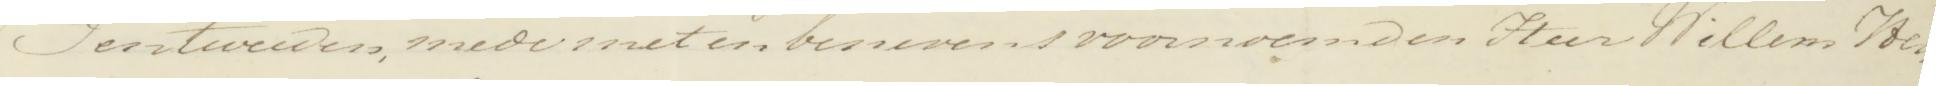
Ten tweeden, mede met en benevens voornoemden Heer Willem Hen
